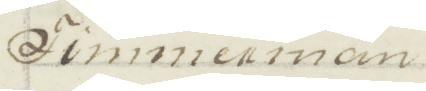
Timmerman
